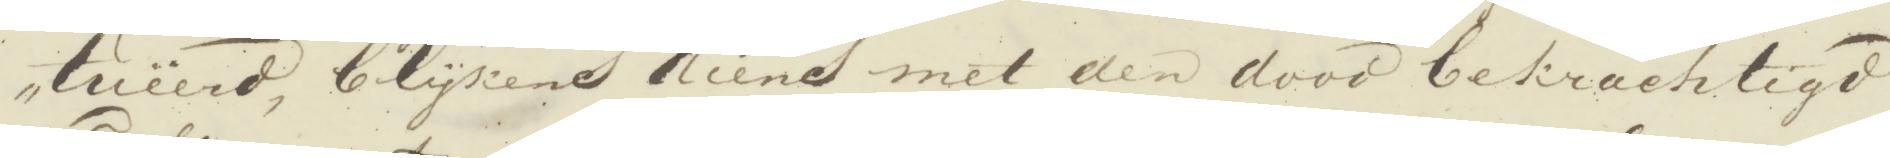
„tuëerd, blijkens diens met den dood bekrachtigd
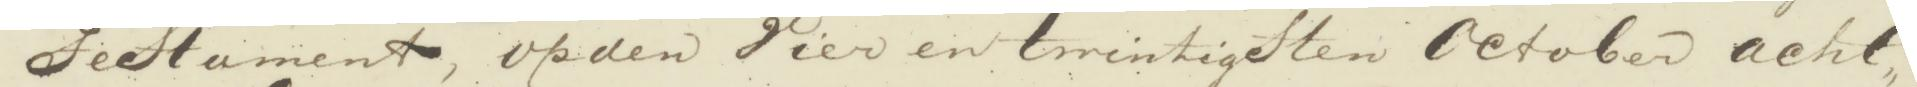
Testament, op den Vier en twintigsten October acht„
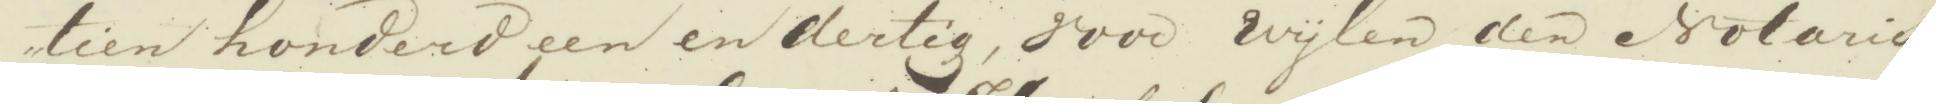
„tien honderd een en dertig, voor wijlen den Notaris
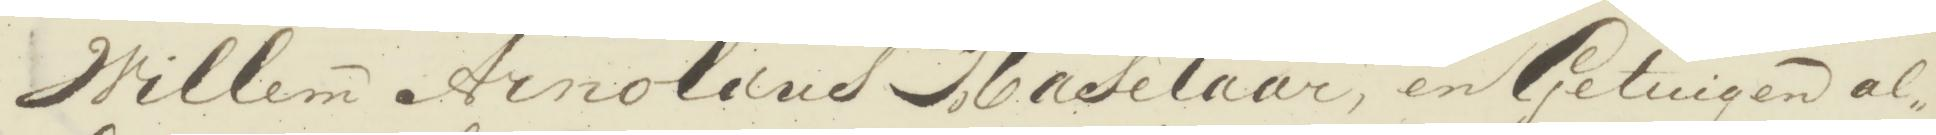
Willem Arnoldus Haselaar, en Getuigen al„
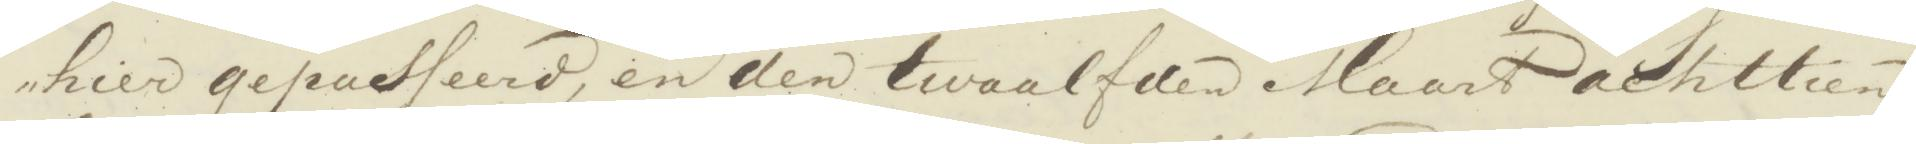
„hier gepasseerd, en den twaalfden Maart achttien
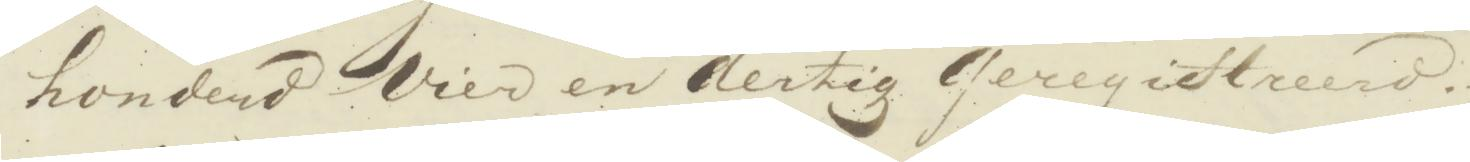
honderd vier en dertig Geregistreerd.
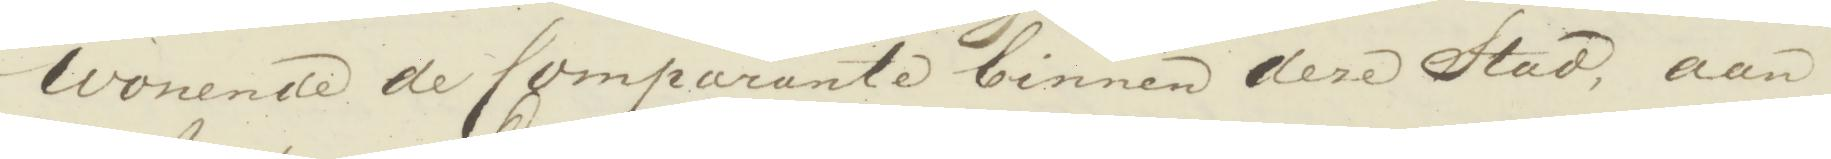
wonende de Comparante binnen deze stad, aan
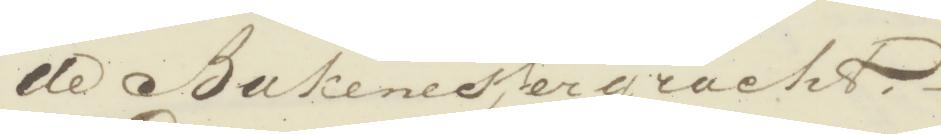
de Bakenessergracht.
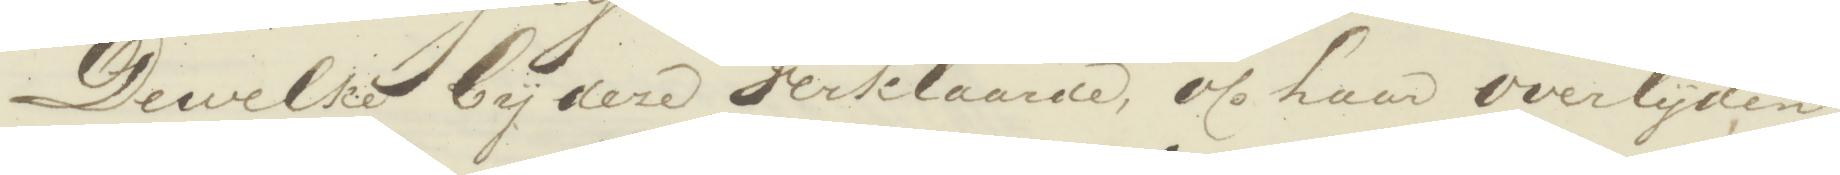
Dewelke bij deze verklaarde, op haar overlijden
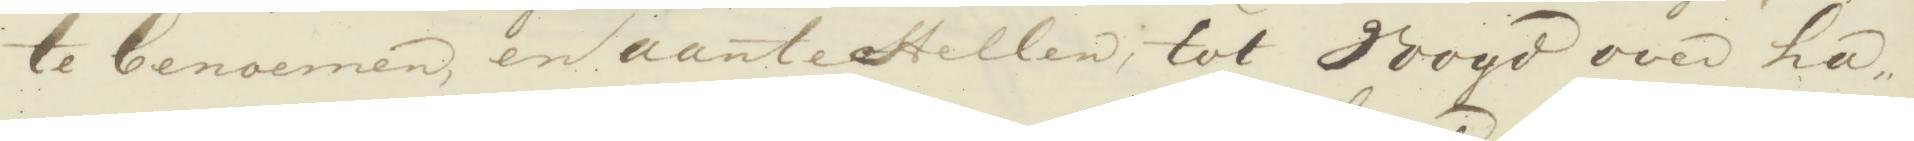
te benoemen, en aan te stellen; tot Voogd over ha„
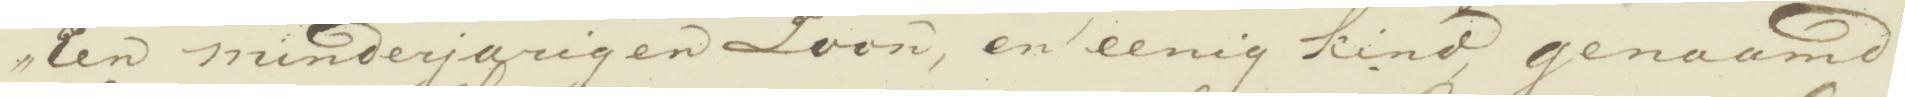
„ren minderjarigen zoon, en eenig kind genaamd
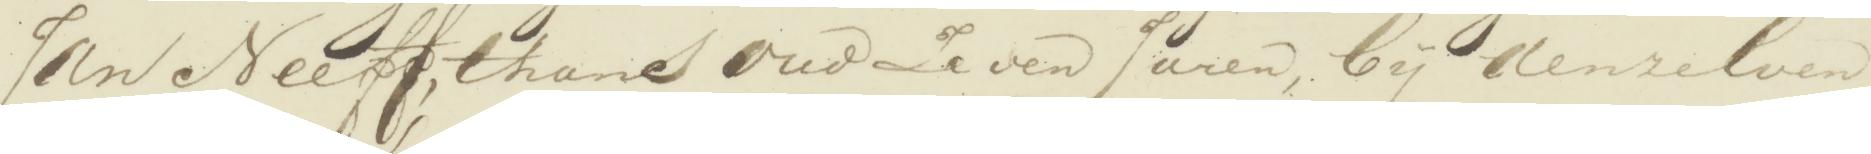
Jan Neeff, thans oud zeven Jaren, bij denzelven
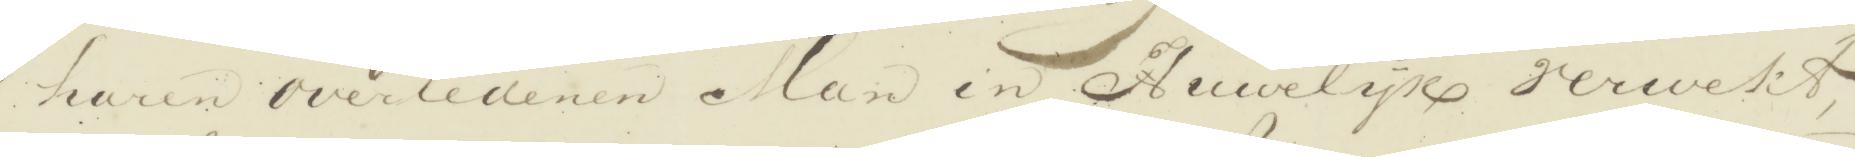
haren overledenen Man in Huwelijk verwekt,
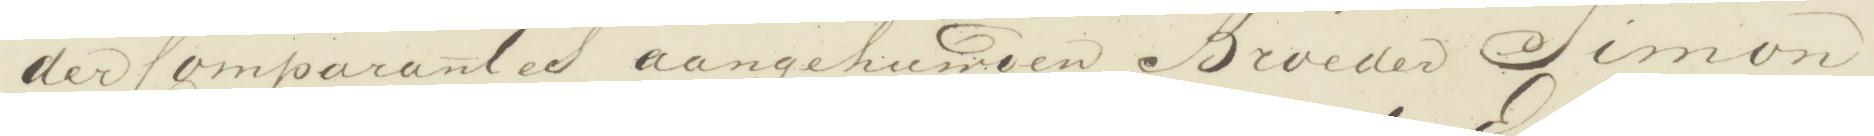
der Comparantes aangehuwden Broeder Simon
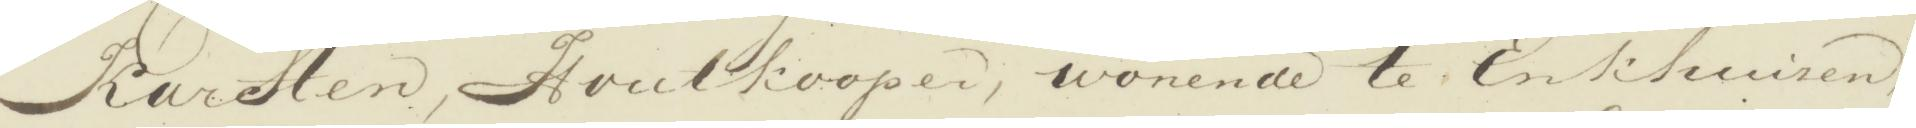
Karsten, Houtkooper, wonende te Enkhuizen,
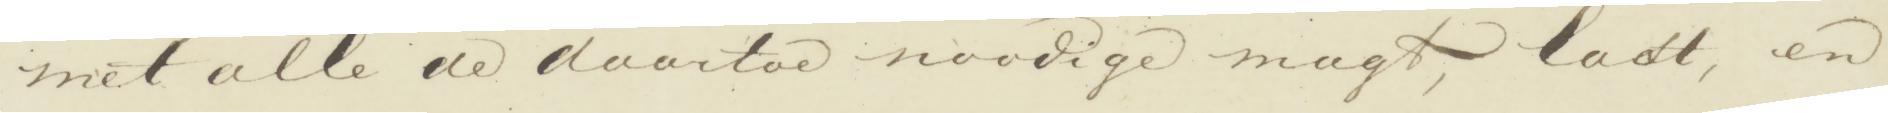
met alle de daartoe noodige magt, last, en
